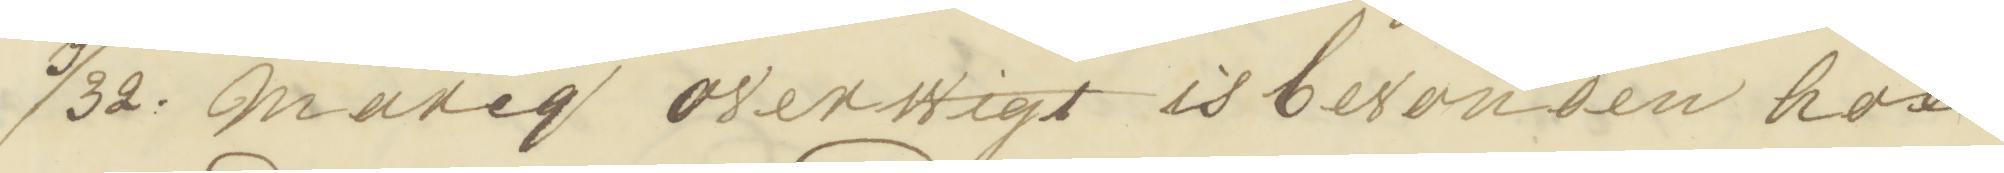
5/32: marcq overwigt is bevonden hoe
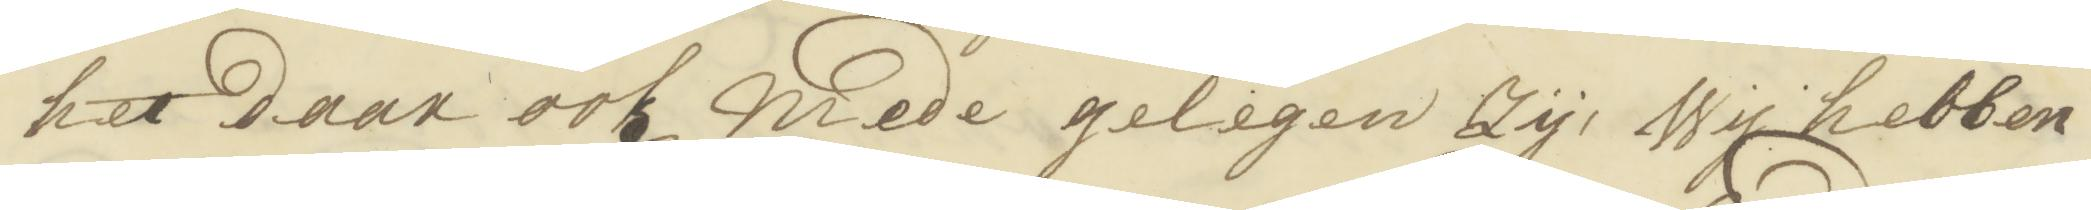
het daar ook mede gelegen zij, wij hebben
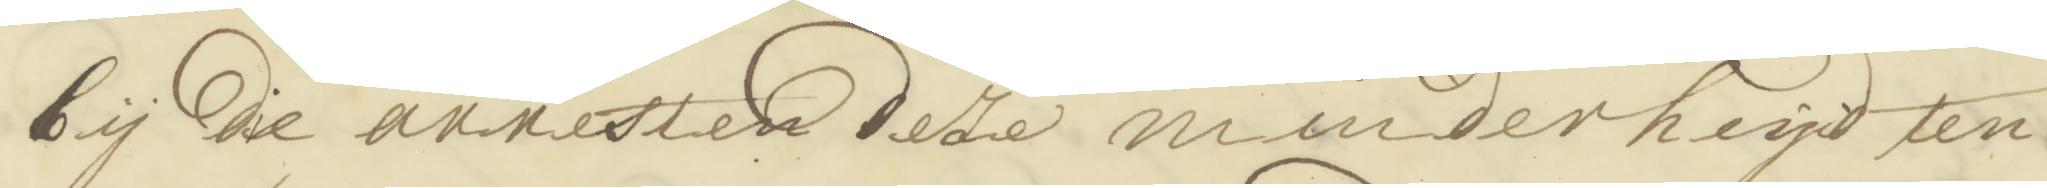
bij die arresten deze minderheijd ten
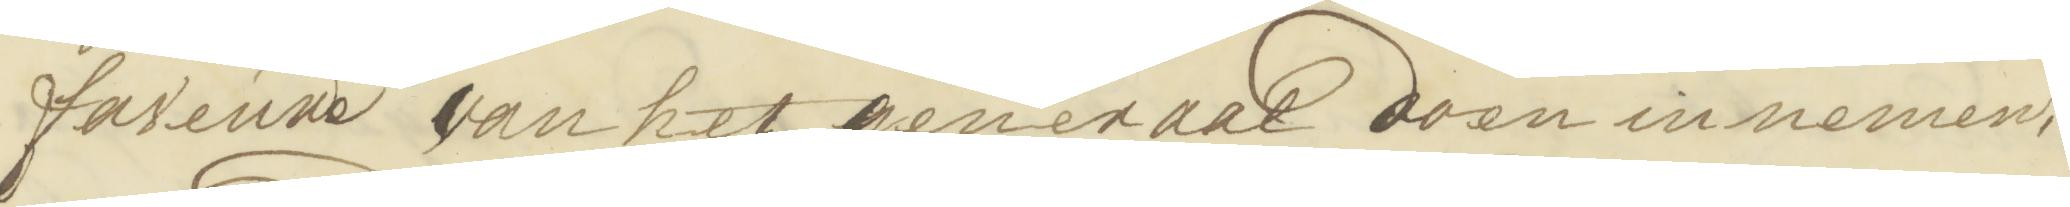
faveure van het generaal doen innemen,
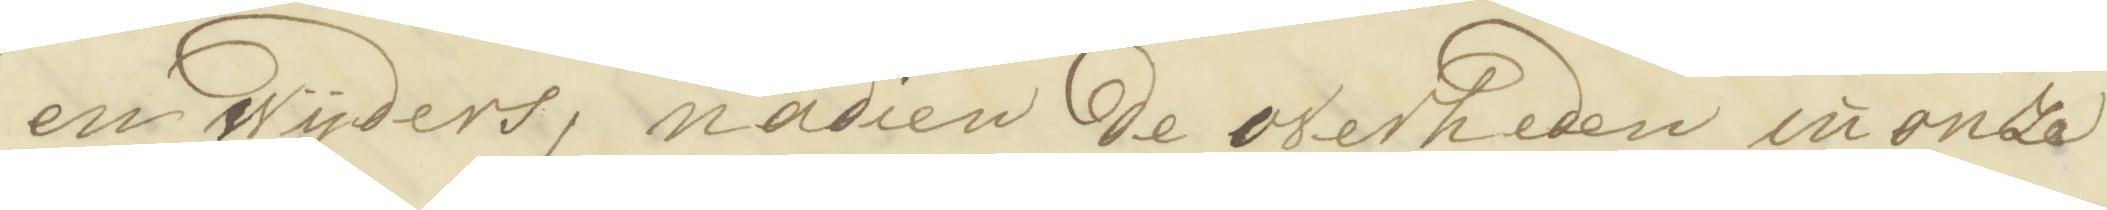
en wijders, nadien de overheden in onze
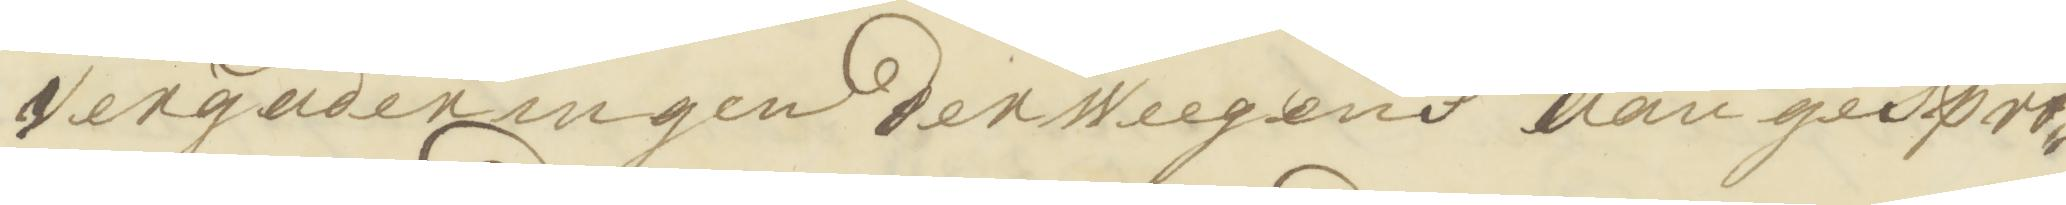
vergaderingen der weegens aan gespro„
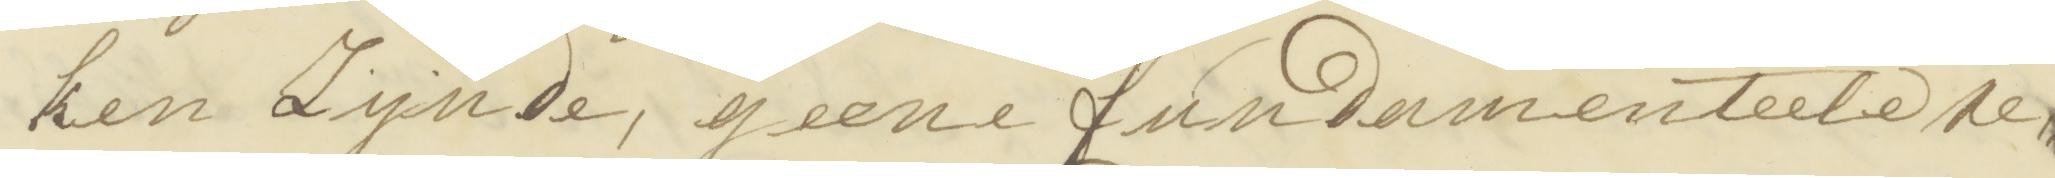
ken zijnde, geene fundamenteele re
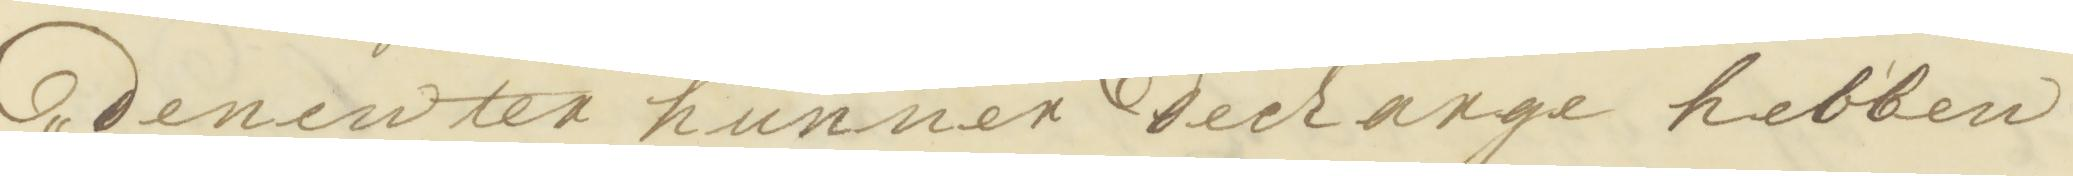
„denen ter hunner decharge hebben
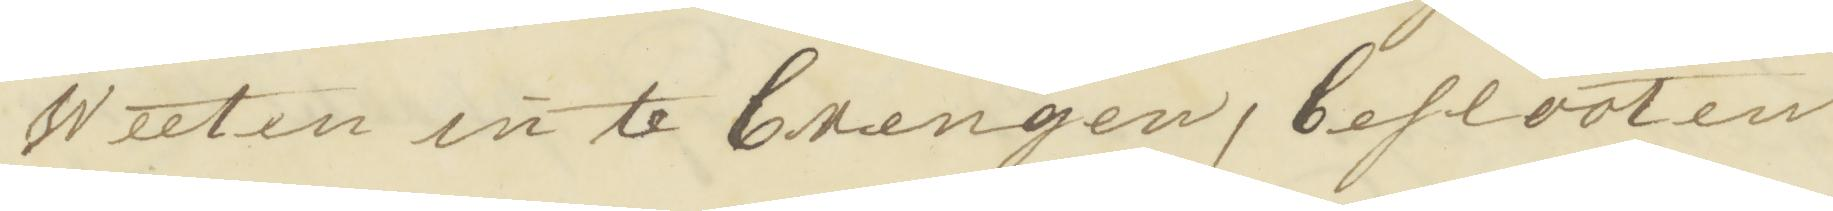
weeten in te brengen, beslooten
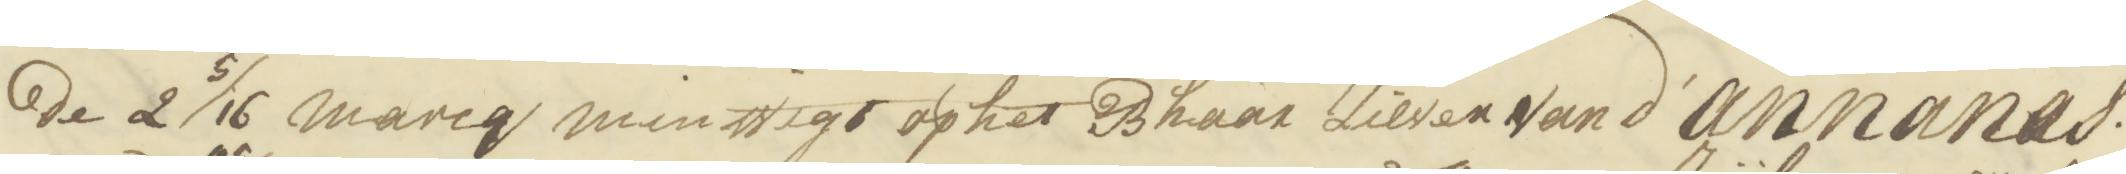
de 2 5/16 marcq min wigt op het Bhaar zilver van d’annanas
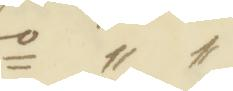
_=o _=o „ „
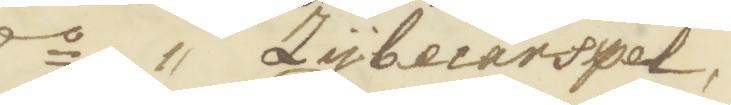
_=o „ zijbecarspel,
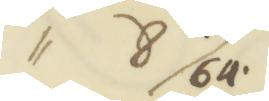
„ 8 45/64.
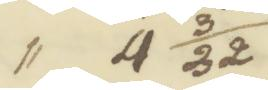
„ 4 3/32
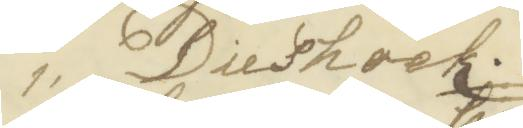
„ Dieshoek.
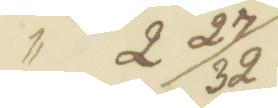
„ 2 27/32
